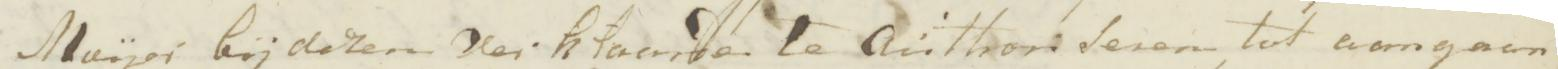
Maijer bij dezen verklaarde te Authoriseren, tot aangaan
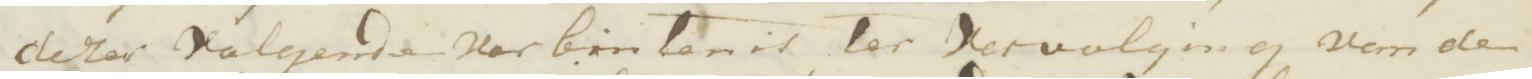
dezer volgende verbintenis ter vervolging van de
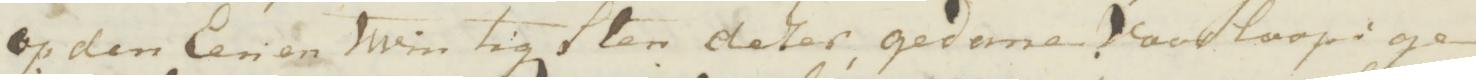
op den Een en twintigsten dezer, gedane voorloopige
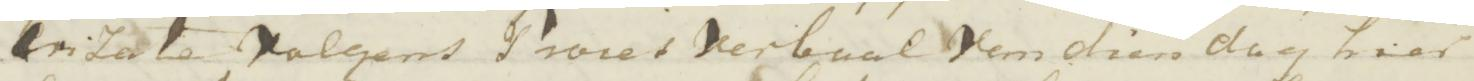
in zate volgens Proces verbaal van dien dag hier
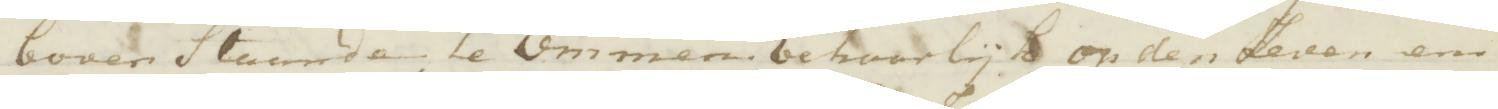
boven staande, te Ommen behoorlijk op den Zeven en
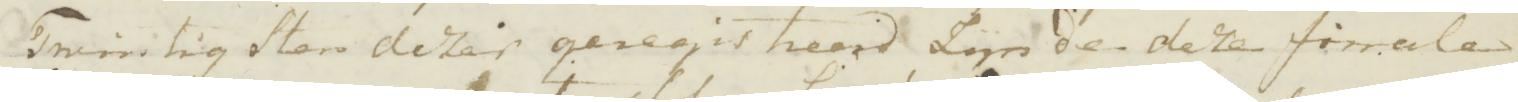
Twintigsten dezer geregisteerd Zijn de deze finale
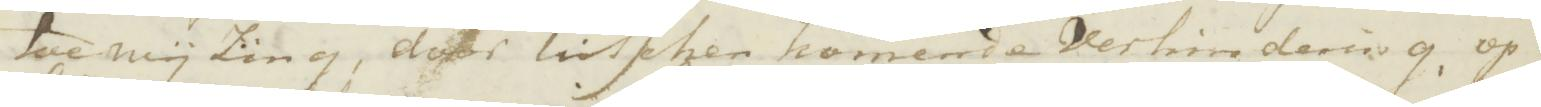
toewijzing, door tusschen komende verhindering, op
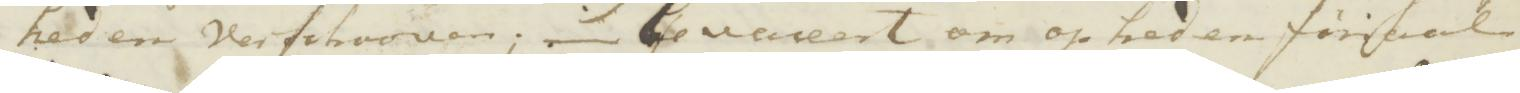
heden verschooven; — Gevaceert om op heden finaal
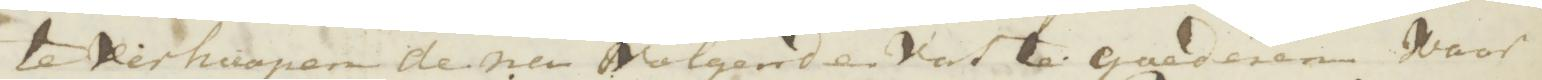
te verkoopen de na volgende vaste goederen, Waar
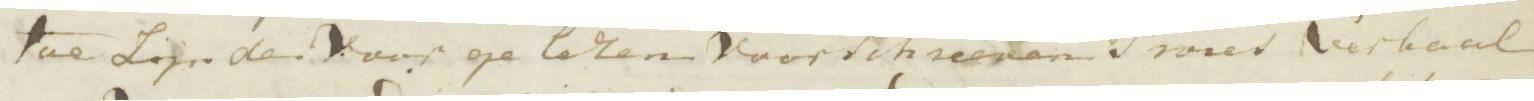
toe Zijn de voor gelezen voorschreeven Proces Verbaal
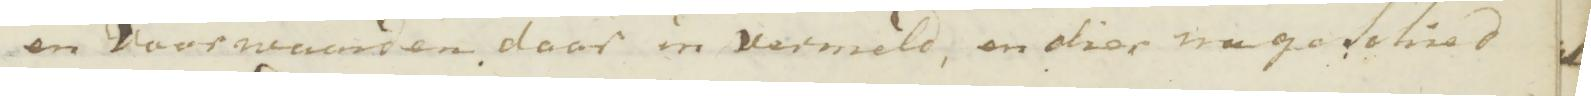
en voorwaarden, daar in vermeld, en dier na geschied
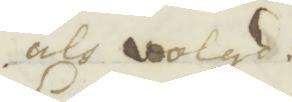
als volgd.
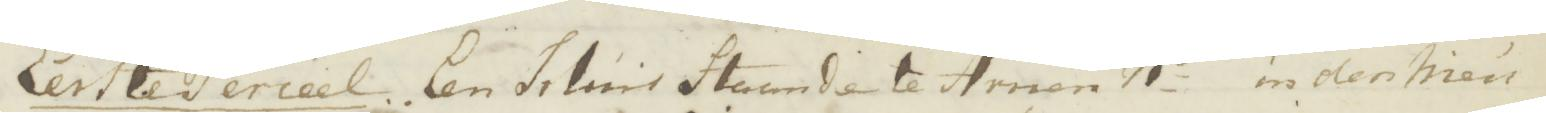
Eerste Perceel, Een Huis Staande te Arrien N=o in den nieu
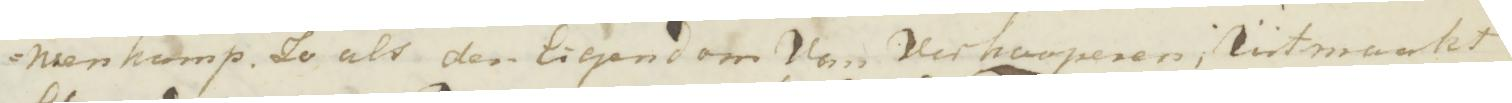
=wenkamp. Zo als den Eigendom van verkooperen; uitmaakt
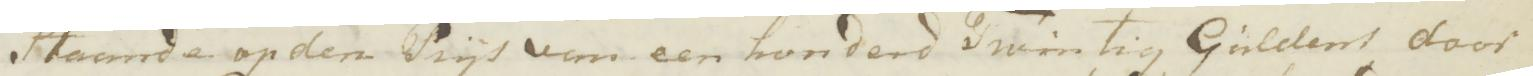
Staande op den Prijs van een honderd twintig Guldens door
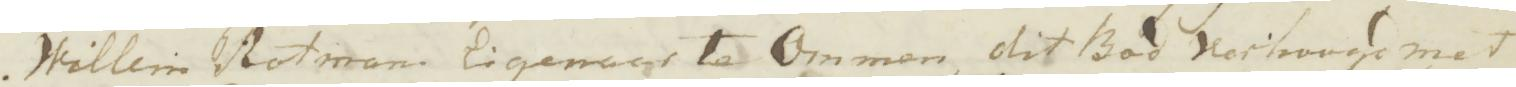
Willem Rotman Eigenaar te Ommen dit Bod verhoogd met
